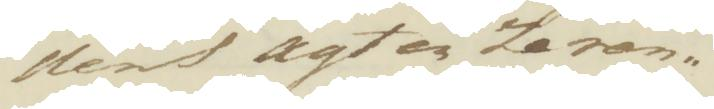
dens agt en zeven„
